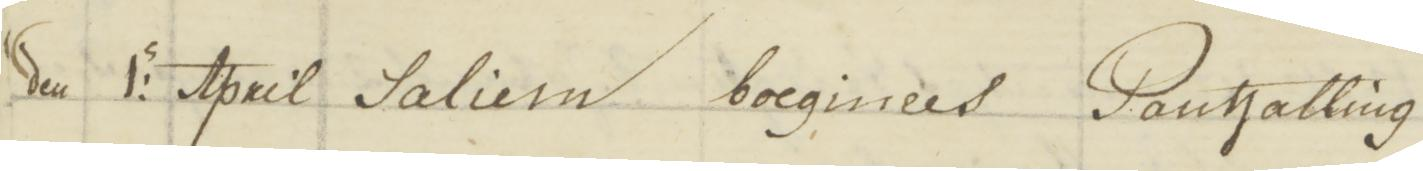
den 1:en April Saliem boeginees Pantjalling
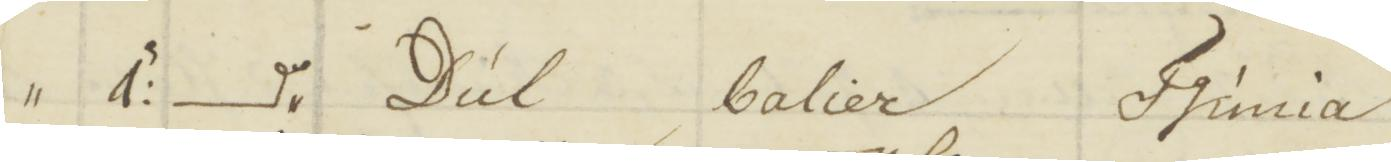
„ 4:en _„o Dul balier Tjunia
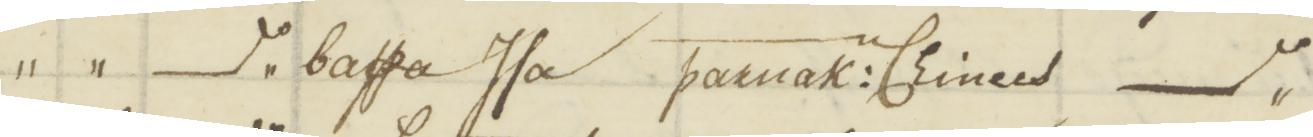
„ „ _„o bappa Jsa parnak: Chinees _„o
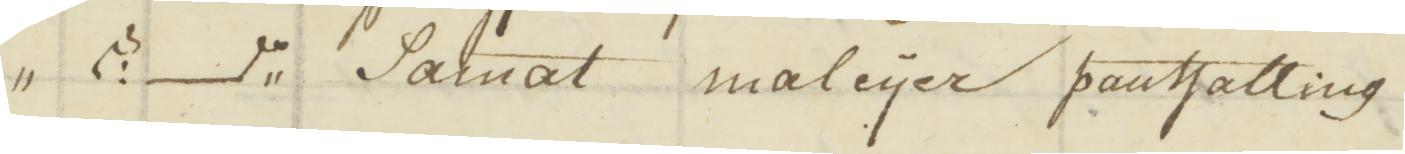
„ 5:en _„o Samat maleijer pantjalling
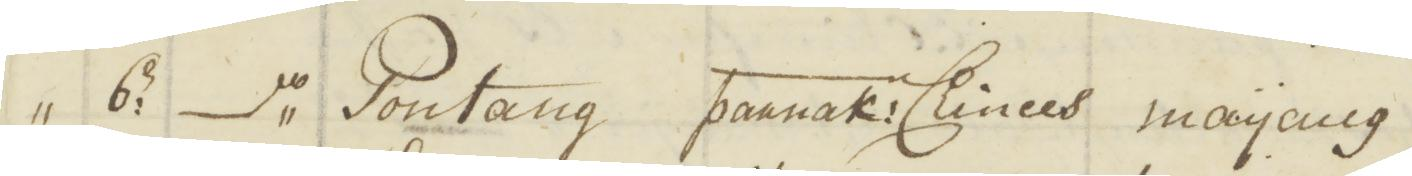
„ 6:en _„o Pontang parnak: Chinees maijang
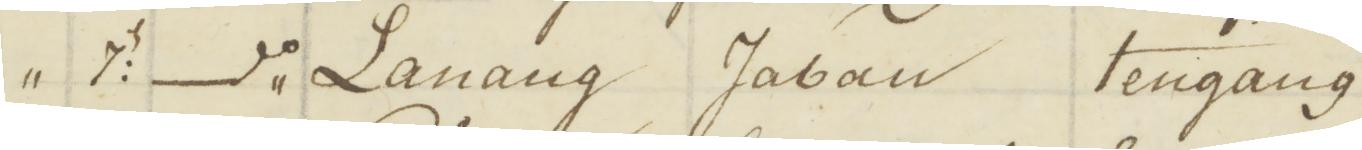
„ 7:en _„o Lanang Javan tengang
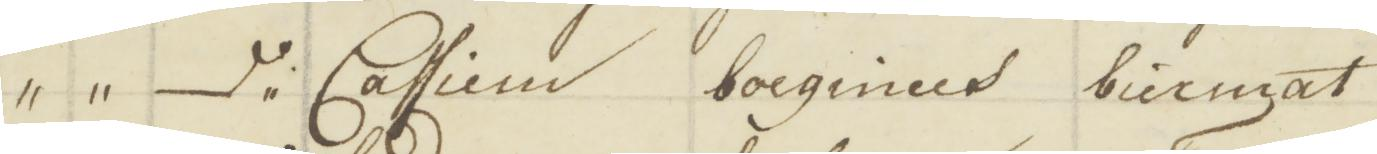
„ „ _„o Cassiem boeginees biermat
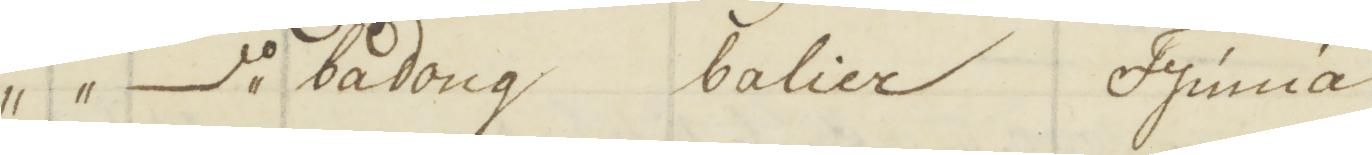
„ _„o badong balier Tjunia
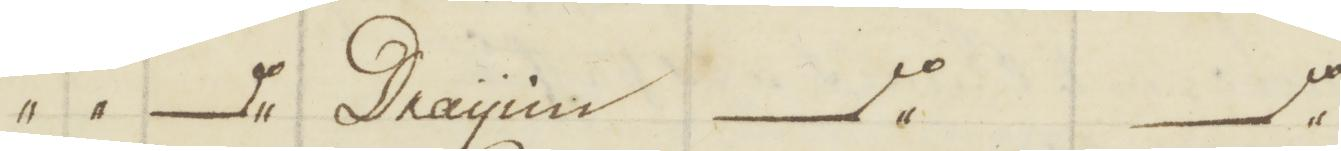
„ „ _„o Draijun _„o _„o
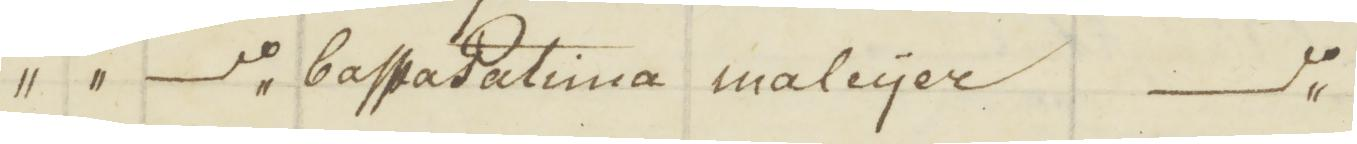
„ „ _„o bappa Patima maleijer _„o
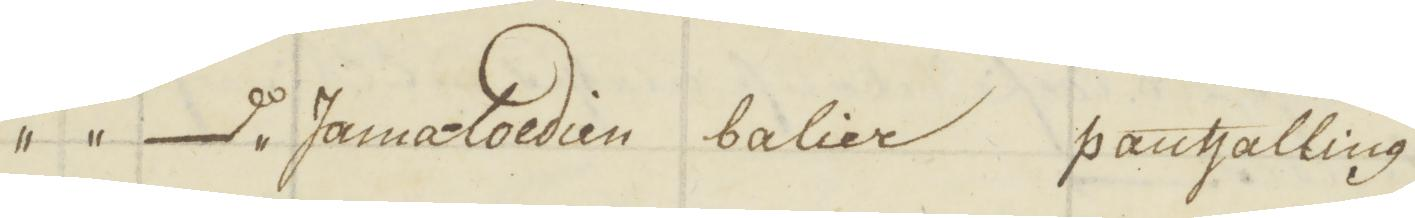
„ „ _„o Jama-loedien balier pantjalling
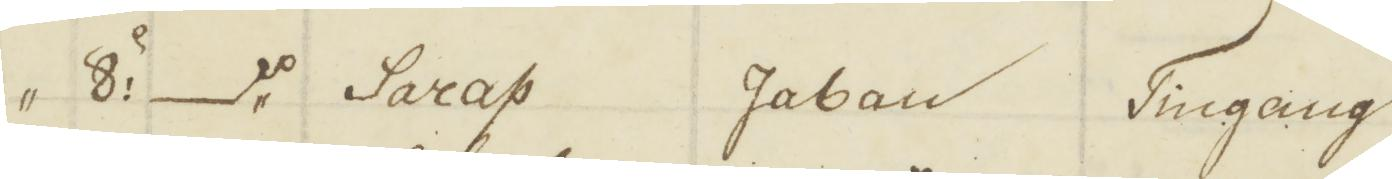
„ 8:en _„o Sarap Javan Tingang
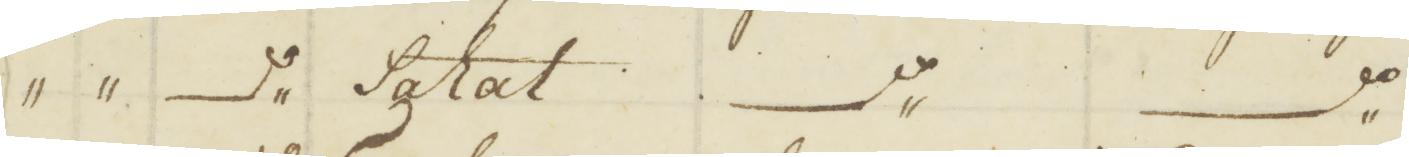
„ „ _„o Sahat _„o _„o
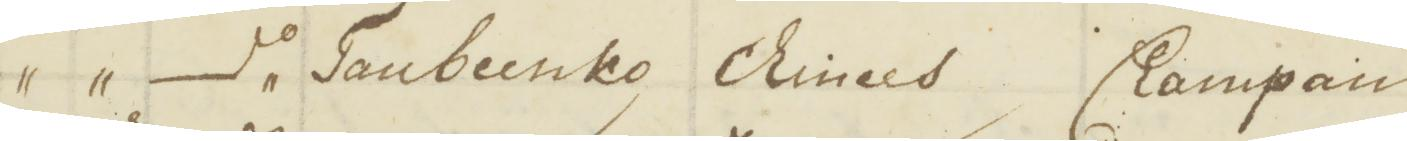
„ „ _„o Tanbeenko Chinees Champan
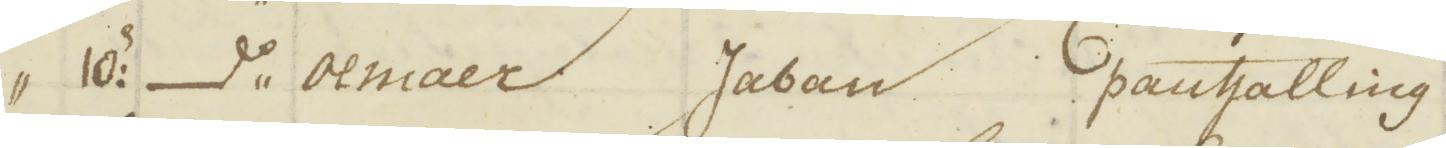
„ 10:en _„o Olmaer Javan pantjalling
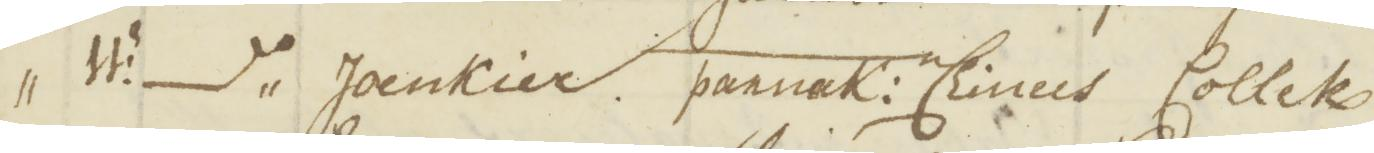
„ 11:en _„o Joenkier parnak: Chinees Collek
